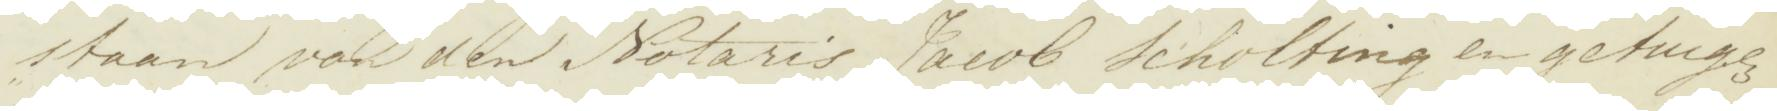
„staan van den Notaris Jacob Scholting en getuigen
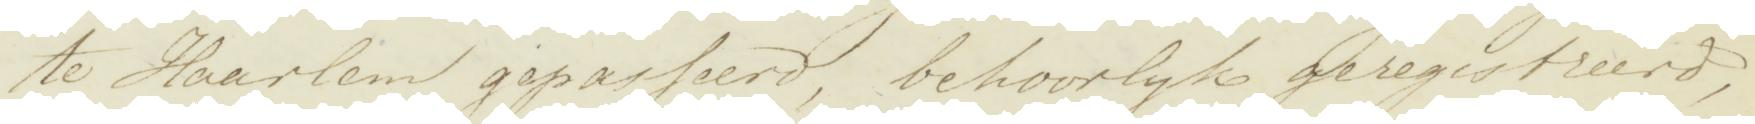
te Haarlem gepasseerd, behoorlyk geregistreerd,
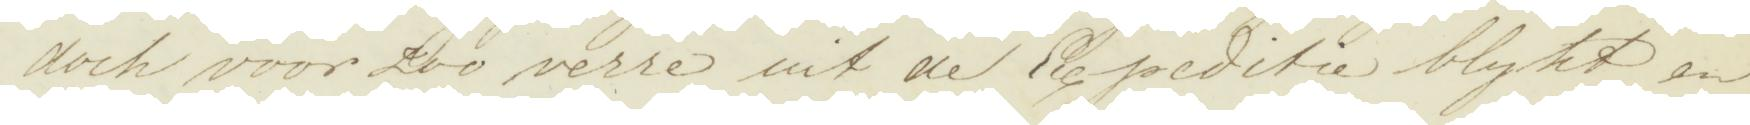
doch voor zoo verre uit de Expeditie blykt en
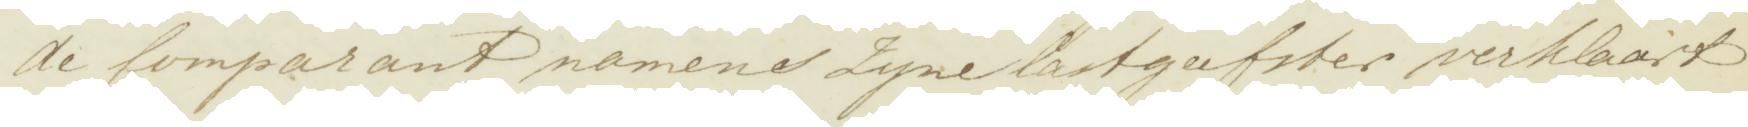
de Comparant namens zyne lastgeefster verklaart
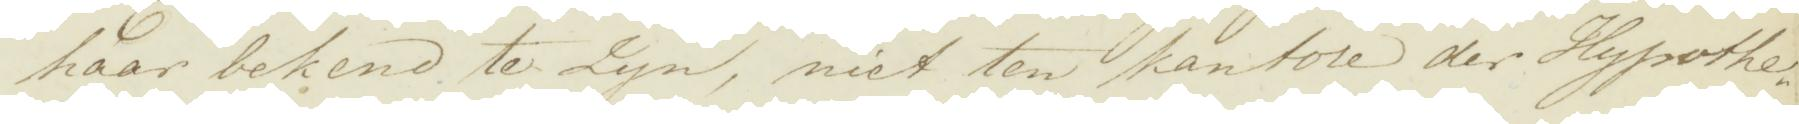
haar bekend te zyn, niet ten kantore der Hypothe„
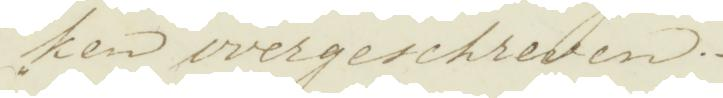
„ken overgeschreven.
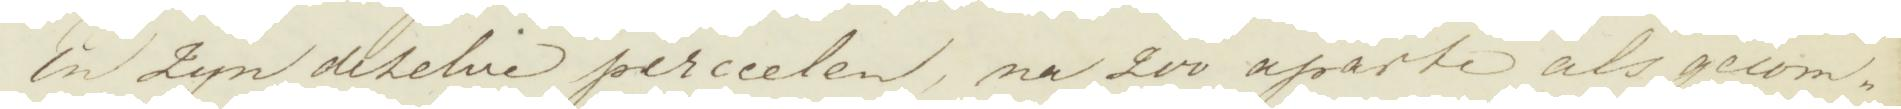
En zyn dezelve perceelen, na zoo aparte als gecom„
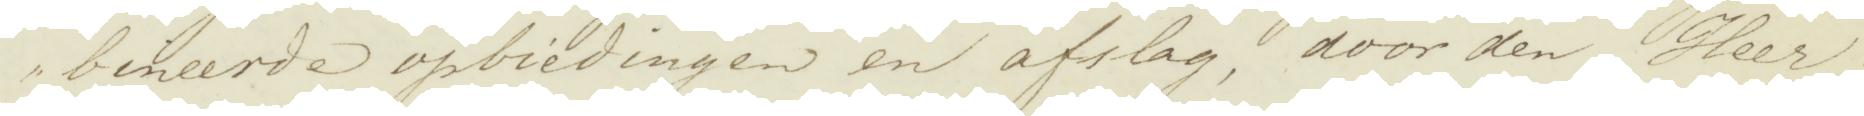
„bineerde opbiedingen en afslag, door den Heer
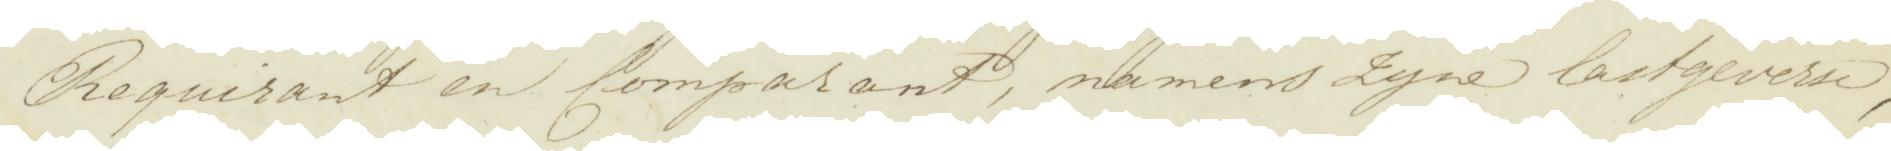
Requirant en Comparant, namens zyne lastgeverse,
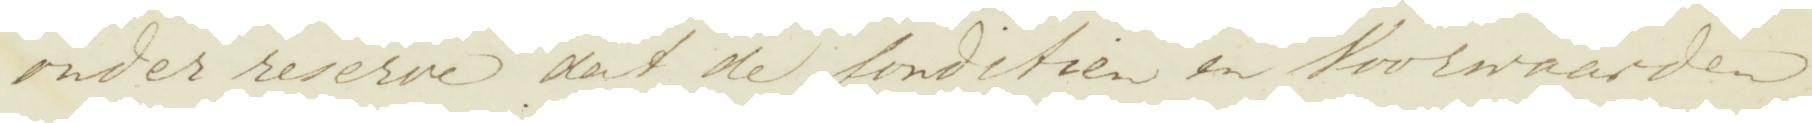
onder reserve dat de Conditien en Voorwaarden
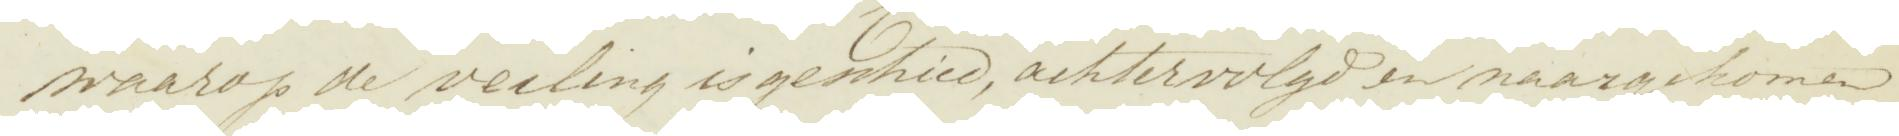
waarop de veiling is geschied, achtervolgd en naargekomen
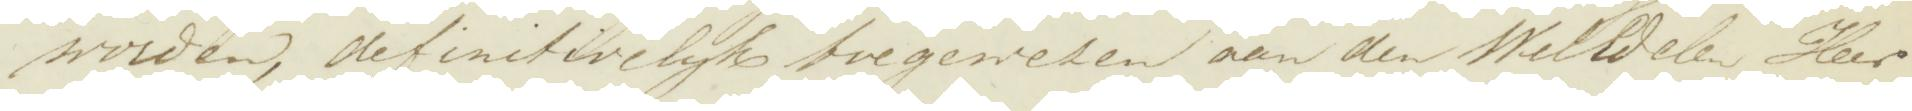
worden, definitivelyk toegewezen aan den WelEdelen Heer
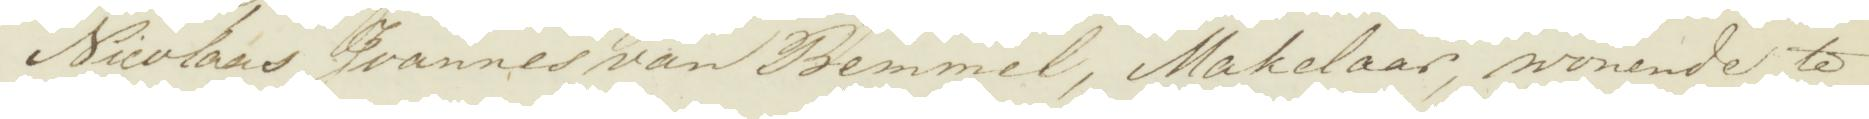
Nicolaas Joannes van Bemmel, Makelaar, wonende te
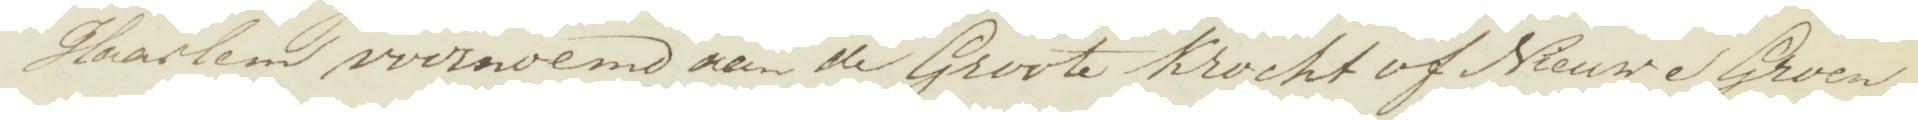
Haarlem voornoemd aan de Groote Krocht of Nieuwe Groen
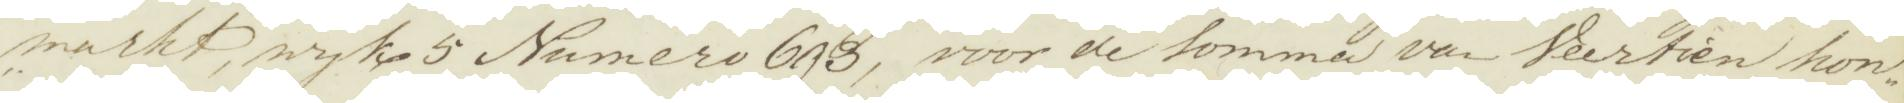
„markt, wyk 5 Numero 693, voor de somma van Veertien hon„
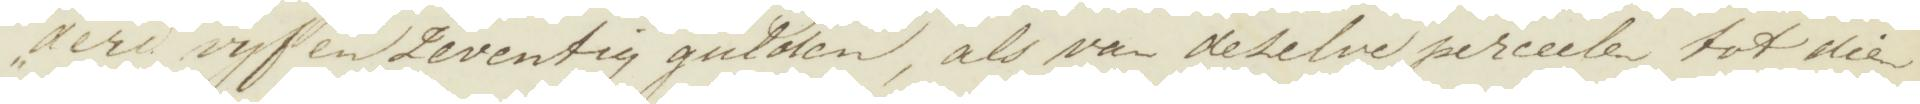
„derd vyf en zeventig gulden, als van dezelve perceelen tot dien
